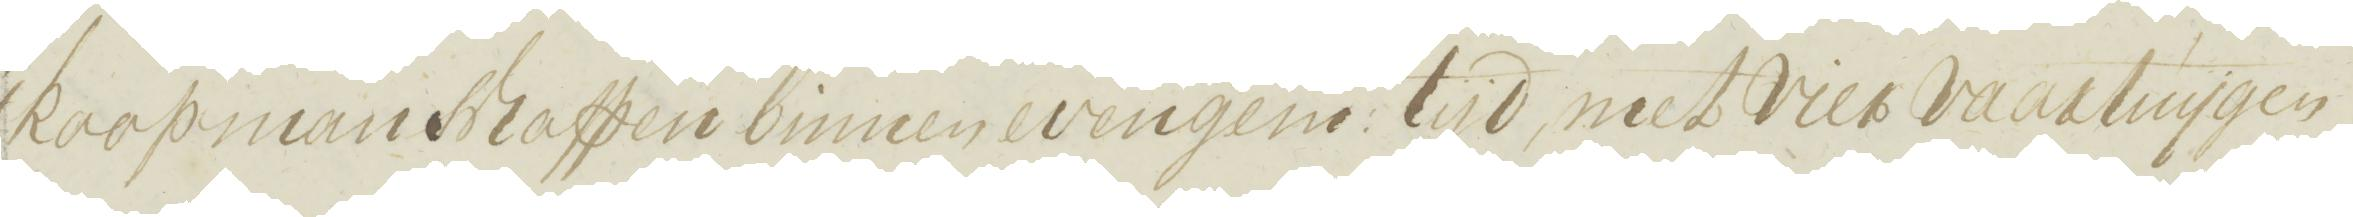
koopmanschappen binnen evengem: tijd, met vier vaartuijgen
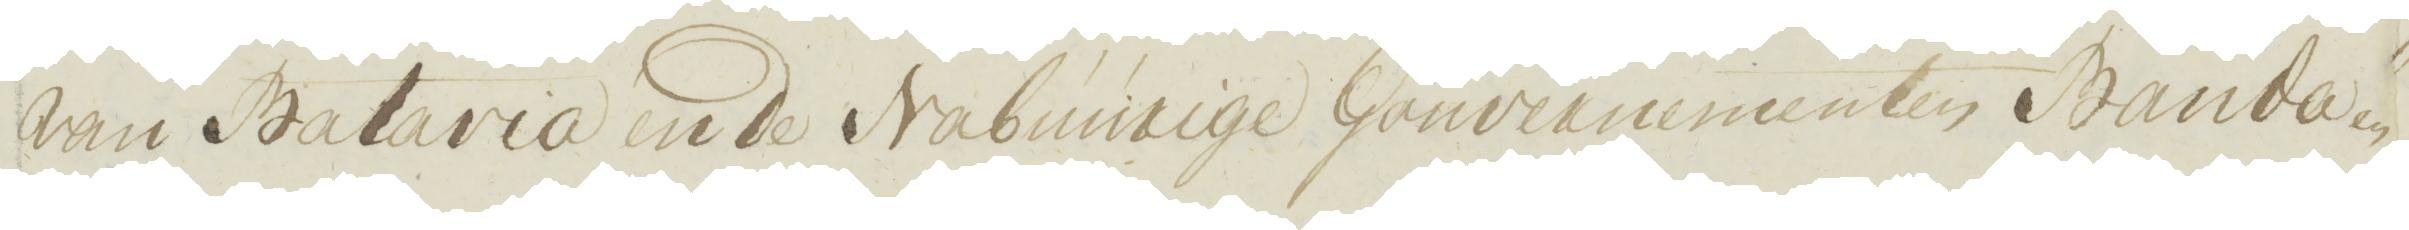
van Batavia en de Nabuurige Gouvernementen Banda en
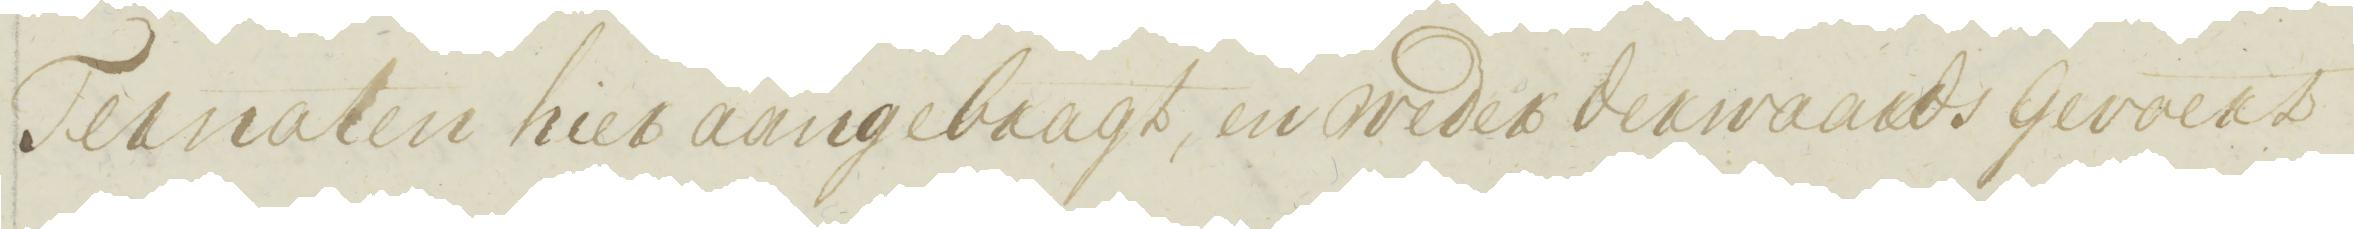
Ternaten hier aangebragt, en weder derwaards gevoert
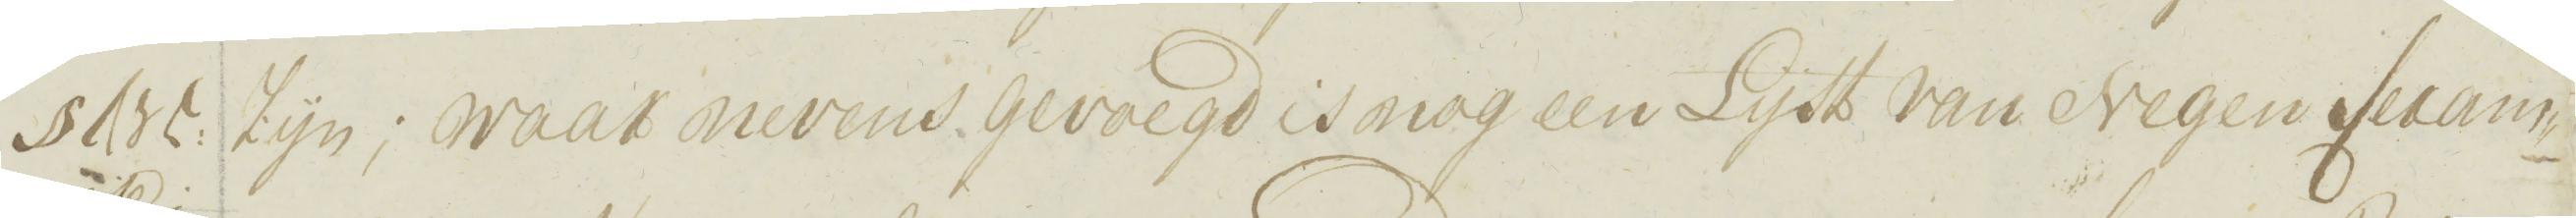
§ 415: zijn; waar nevens gevoegd is nog een Lijst van Negen ceram„
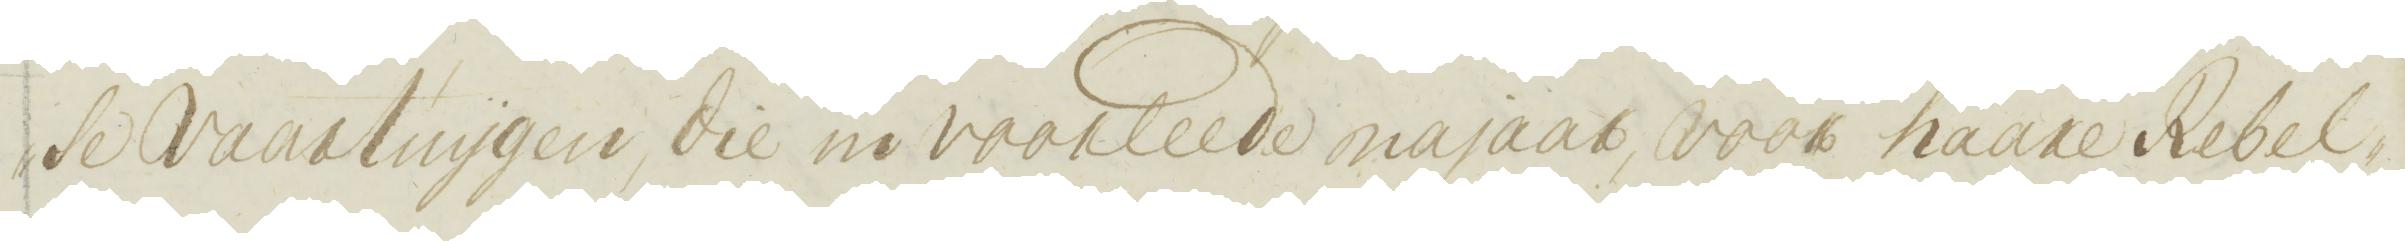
„se vaartuijgen, die in voorleede najaar, voor haare Rebel„
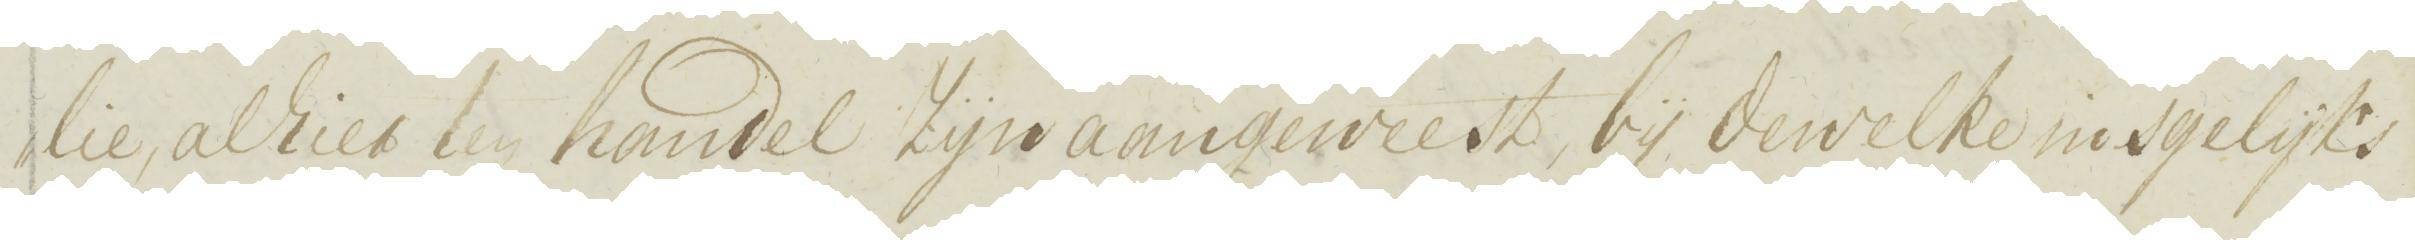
„lie, alhier ten handel zijn aangeweest, bij dewelke insgelijks
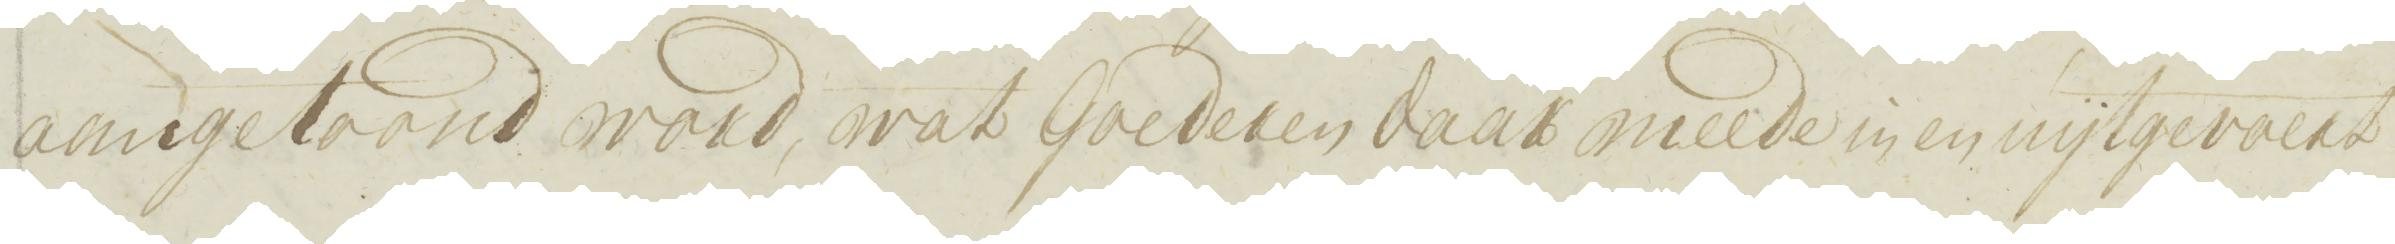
aangetoond word, wat goederen daar meede in en uijtgevoert
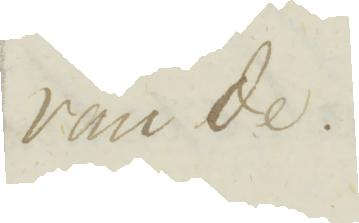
van de.
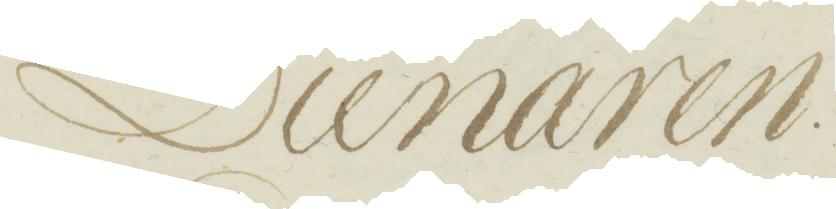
Dienaren.
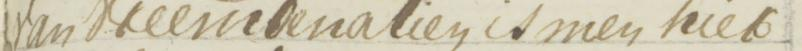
van Vreemdenatien is men hier
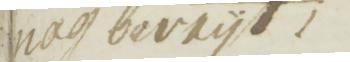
nog bevrijt
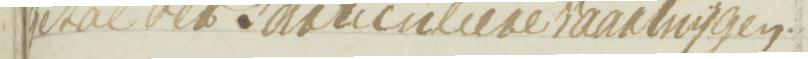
getal der Particuliere vaartuijgen.
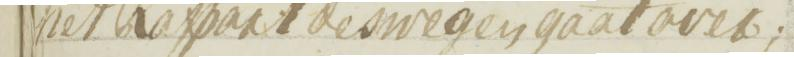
het Rapport deswegen gaatover;
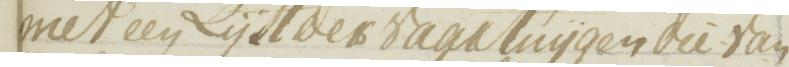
met een Lijst der vaartuijgen die van
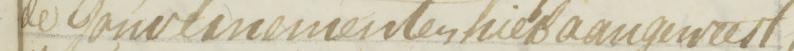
de Gouvernementen hier aangeweest
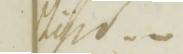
zijn.-
